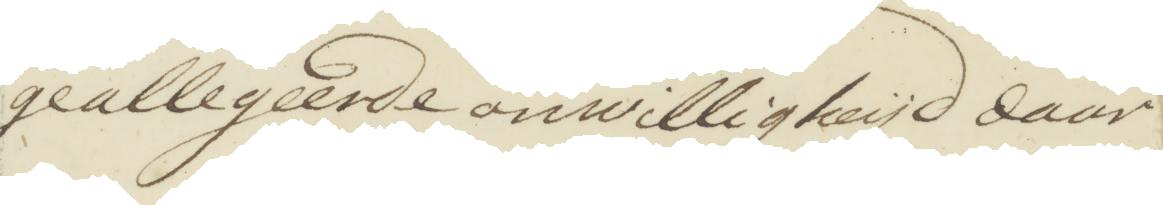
geallegeerde onwilligheijd daar
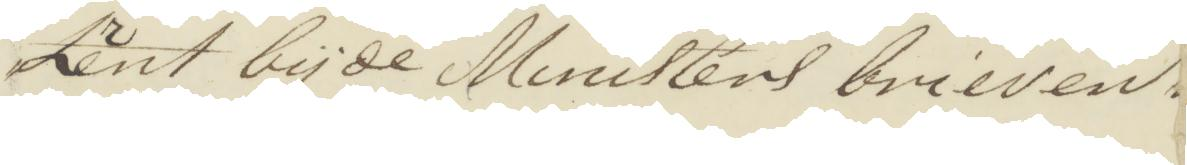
trent bij de Ministers brieven
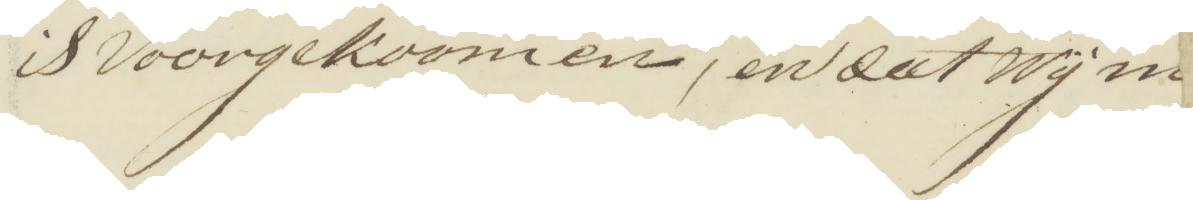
is voorgekoomen, en dat wij m
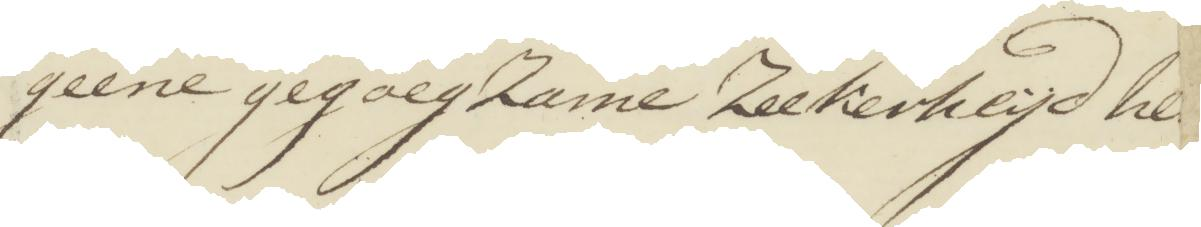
geene gegoegzame zeekerheijd he
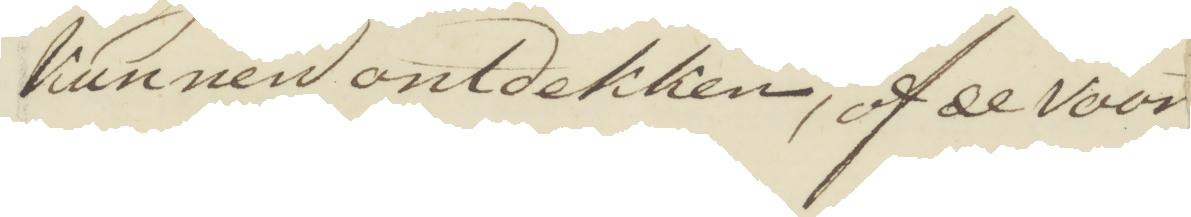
kunnen ontdekken, of de voor
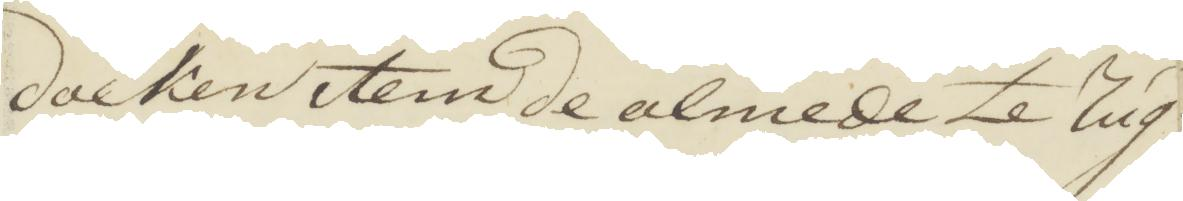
doeken item de almede te rug
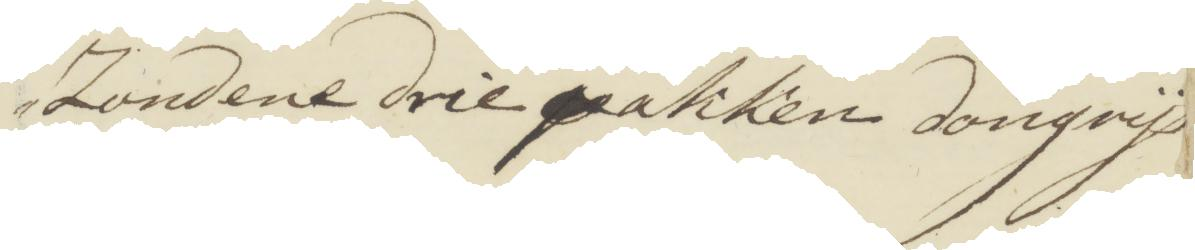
„zondene drie pakken dongrij
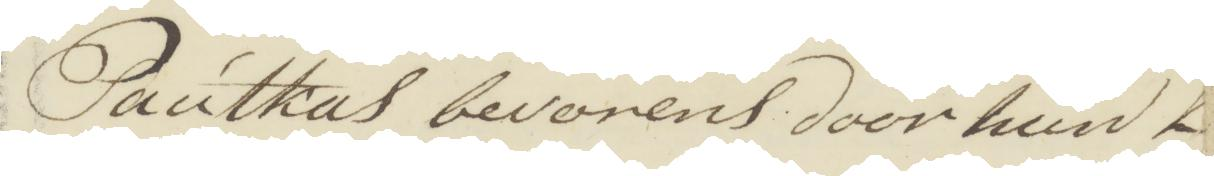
Pautkas bevorens door hun
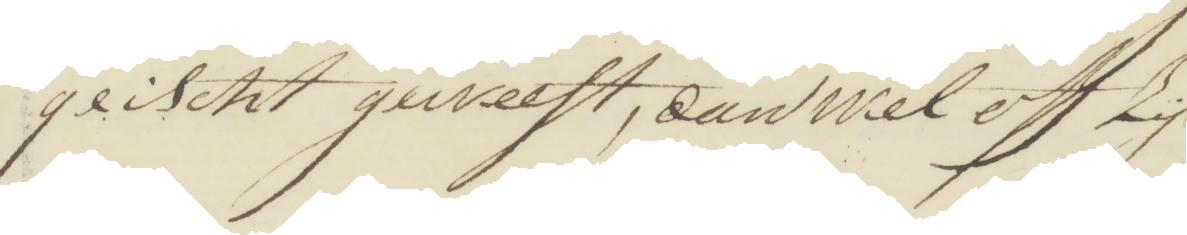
geischt geweest, aan wel off tij
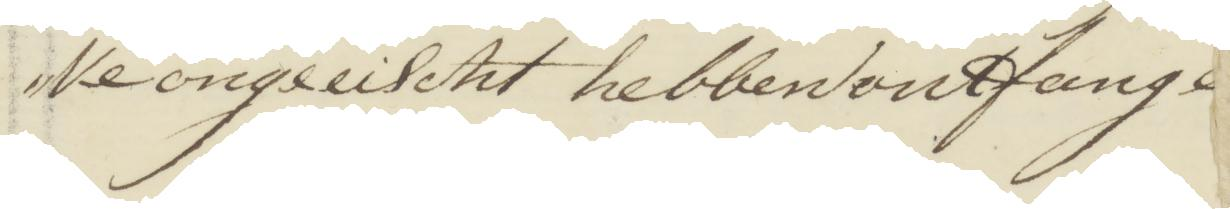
„ve ongeeischt hebben ontfange
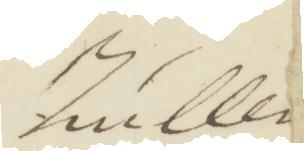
zulle
